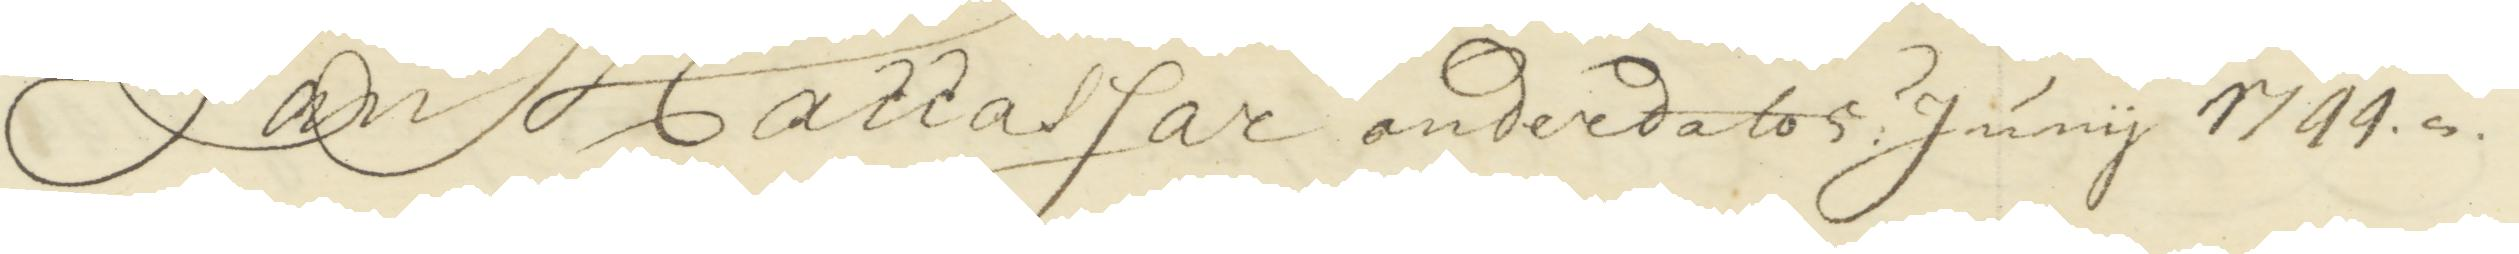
Van Maccassar onderdato 5:' Junij 1744.~.
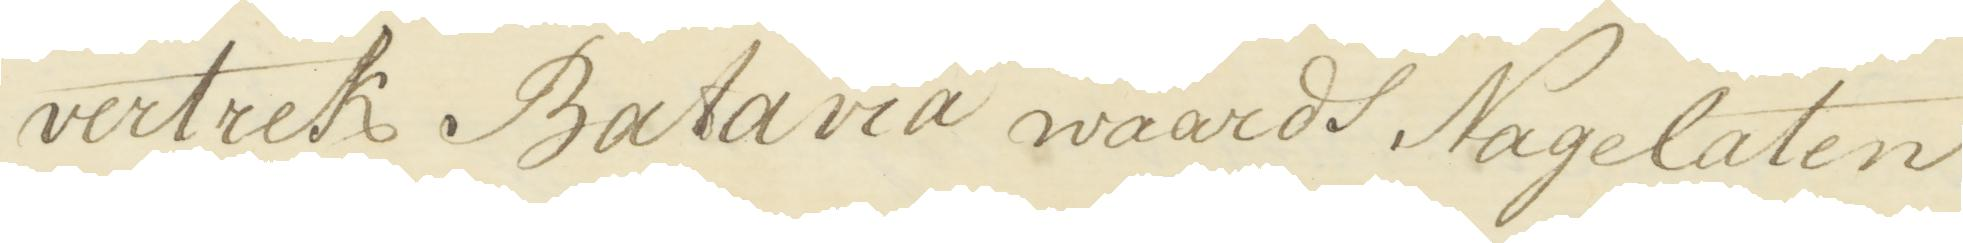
vertrek Batavia waards Nagelaten
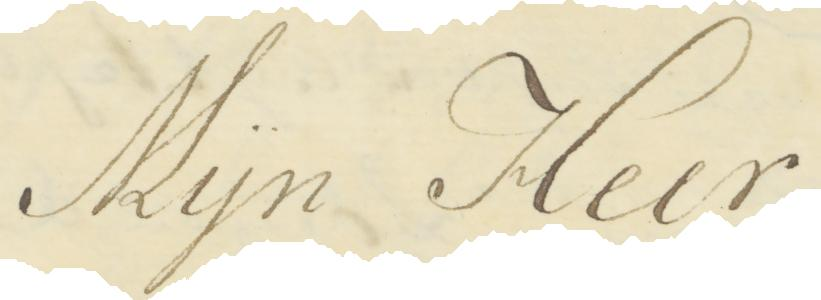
Mijn Heer;
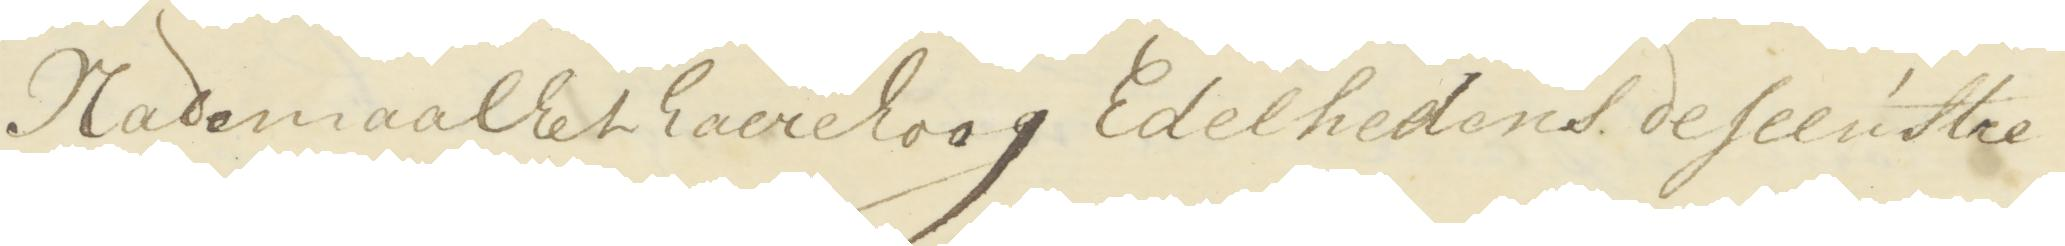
Nademaalhet haerehoog Edelhedens de Jllustre
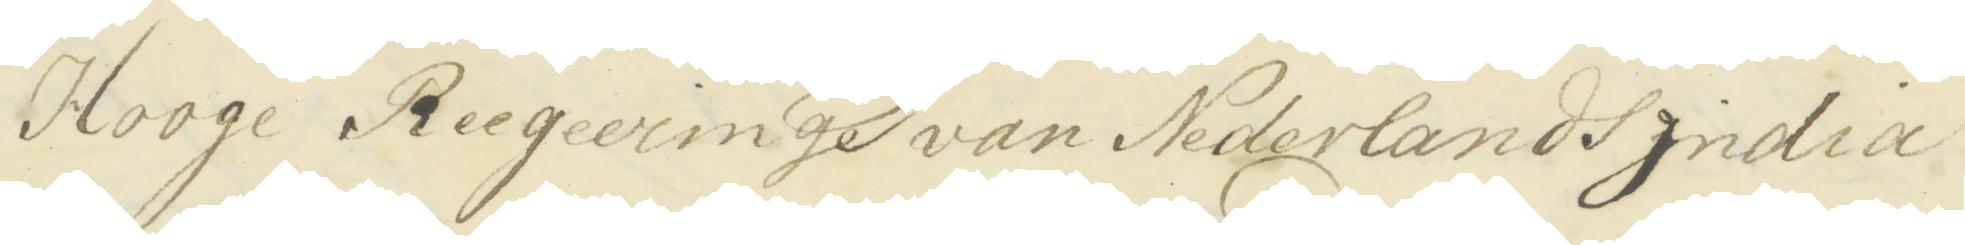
Hooge Reegeeringe van Nederlands Jndia
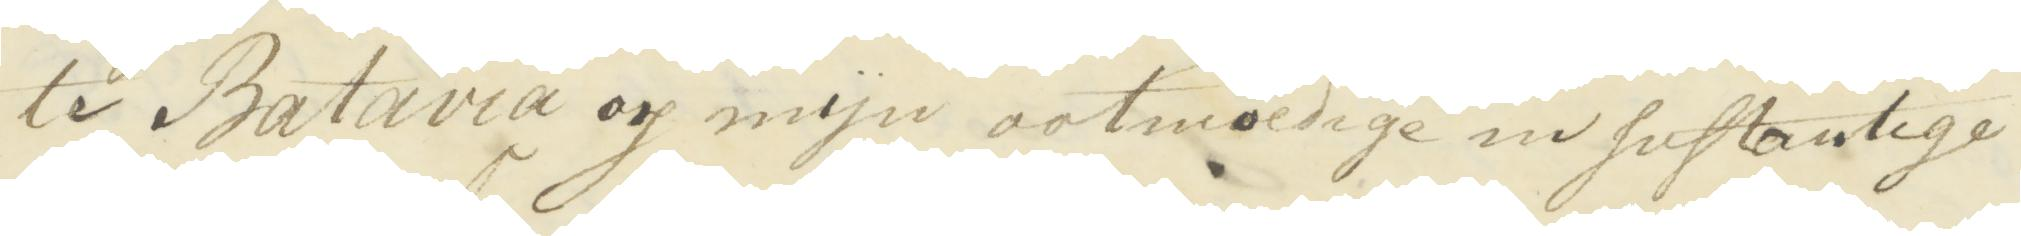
te Batavia op mijn ootmoedige in sustantige
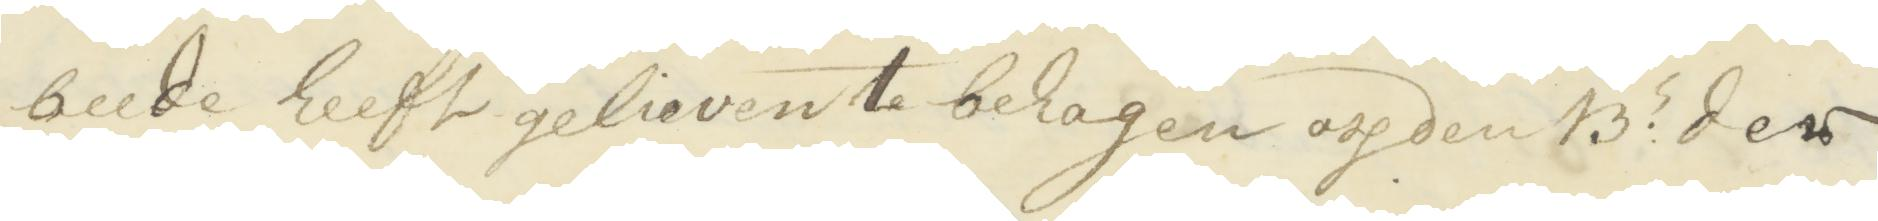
beede heeft gelieven te behagen op den 13:' der
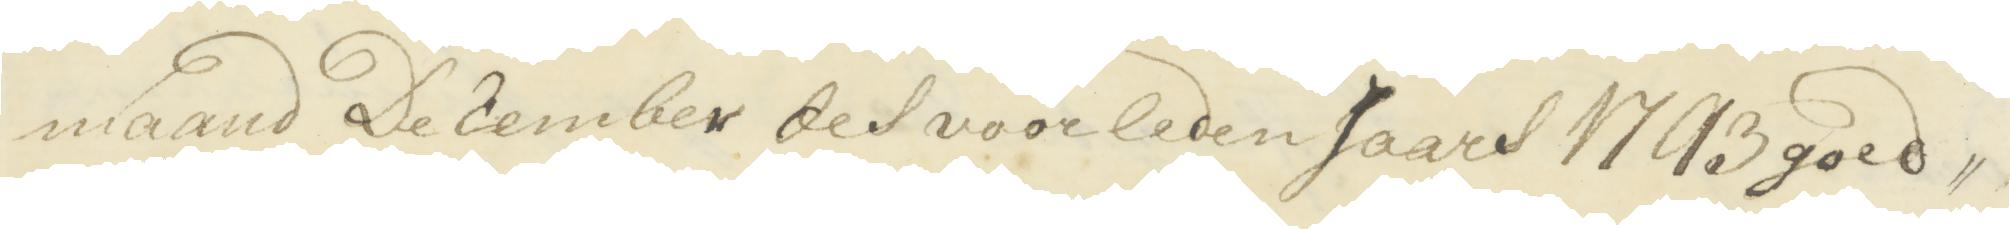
maand December des voorleden Jaars 1743 goed„
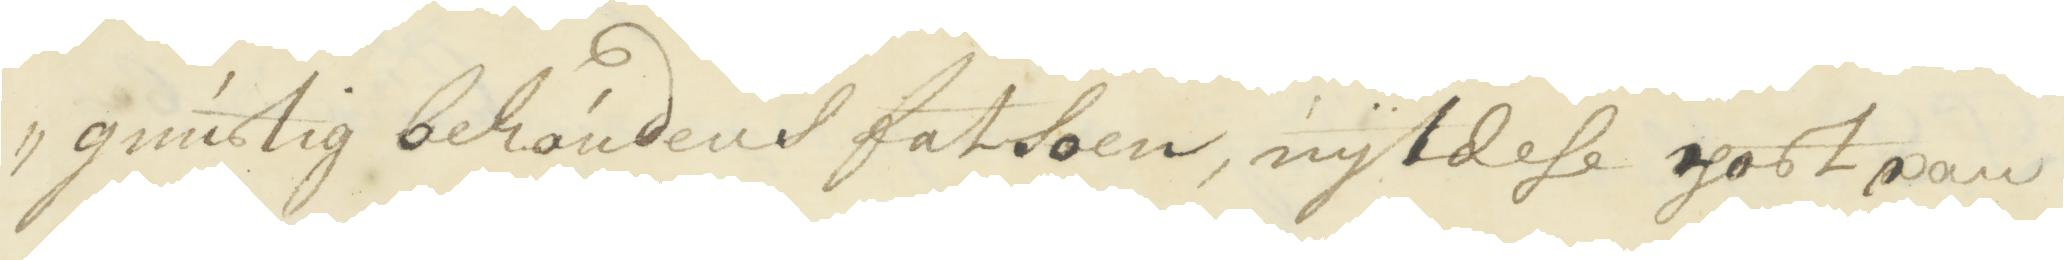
„gunstig behoudens fatsoen, uijt dese post van
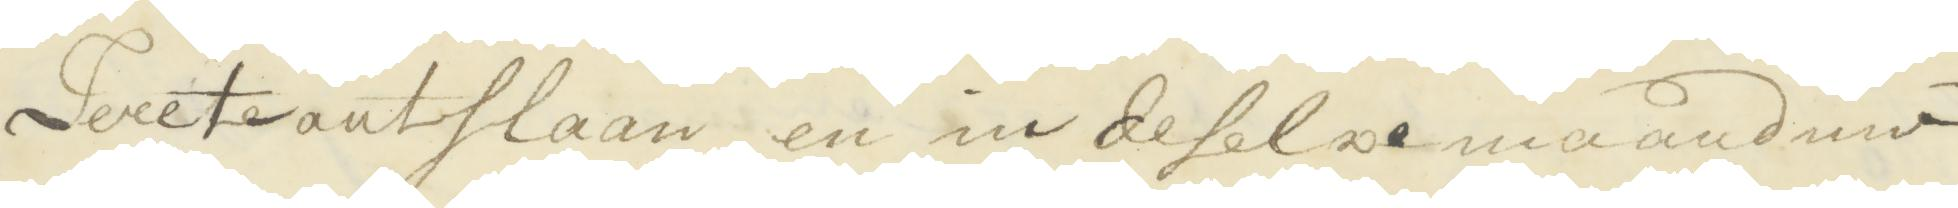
Eere te ontslaan, en in deselve maand uw
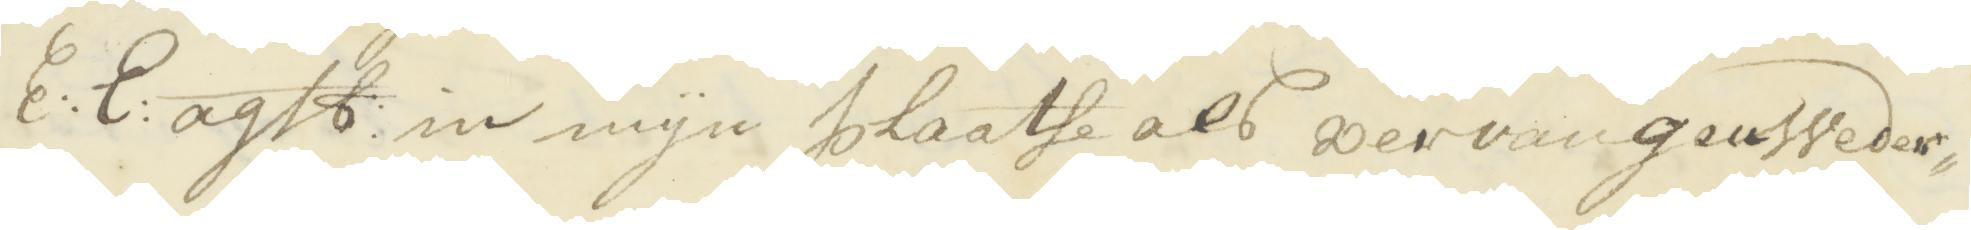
E: E: agtb: in mijn plaatse als vervanger weder„
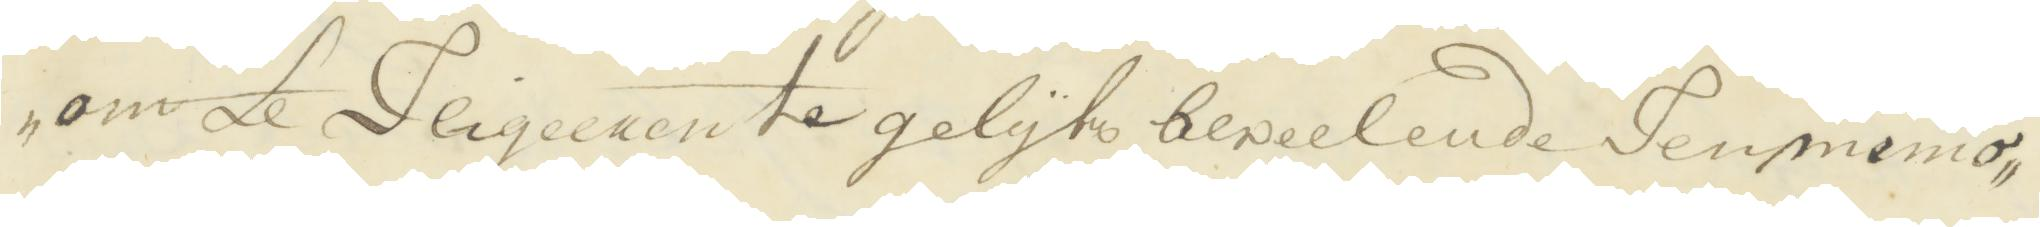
„om te Eligeeren te gelijk beveelende Eenmemo„
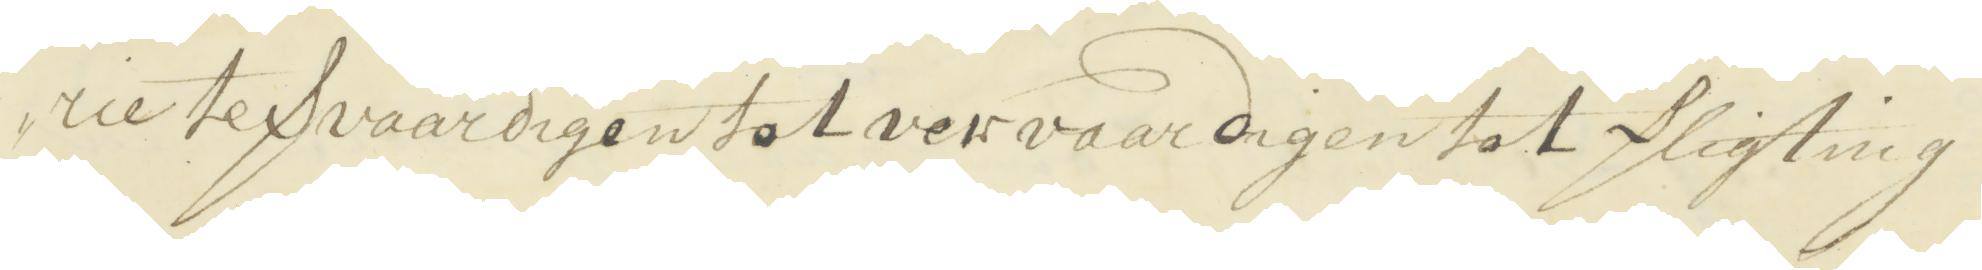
„rie te vervaardigen tot vervaardigen tot verligting
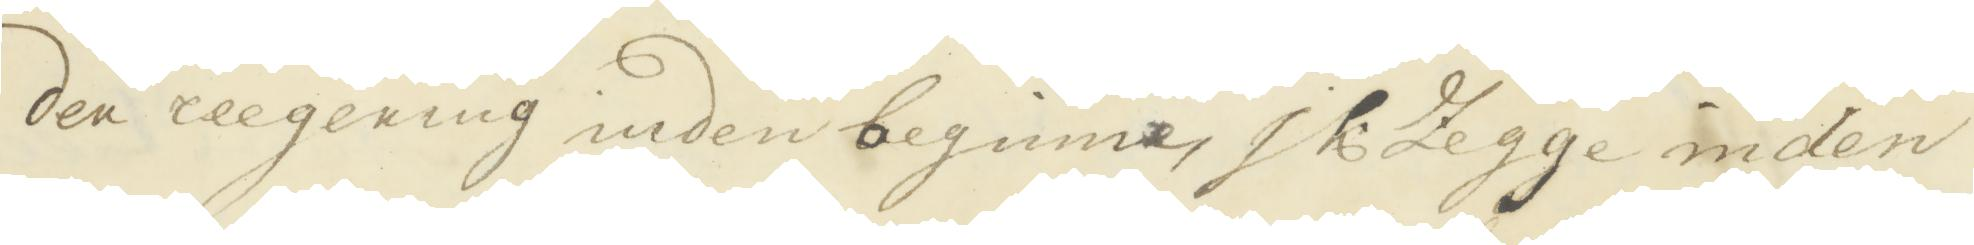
der reegering inden beginne, jk zegge inden
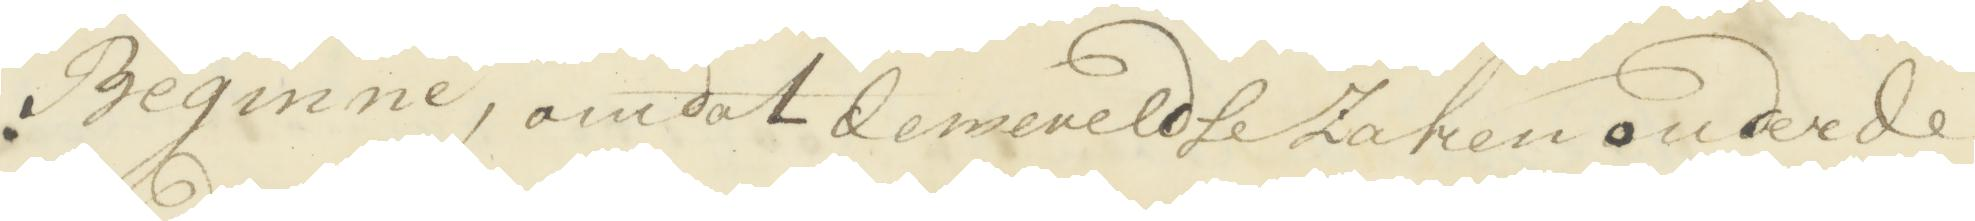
Beginne, om dat de wereldse zaken onder de
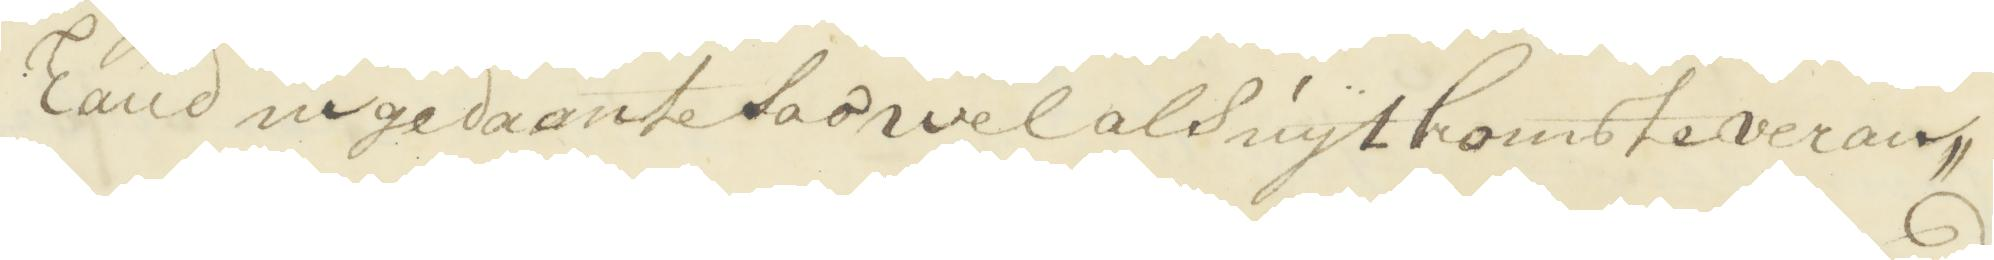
hand in gedaante soo wel als uijtkomste veran„
